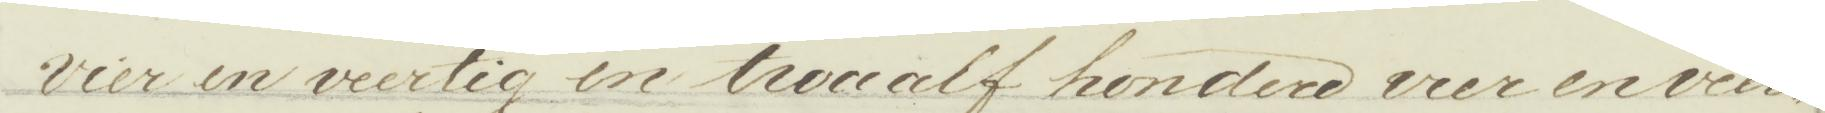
vier en veertig en twaalf honderd vier en veer„
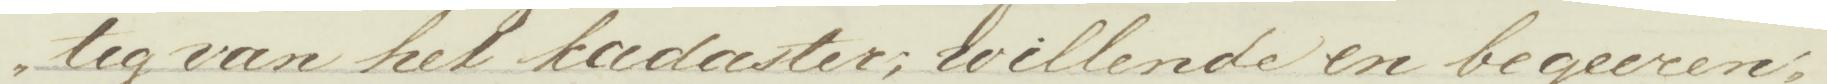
„tig van het kadaster, willende en begeeren„
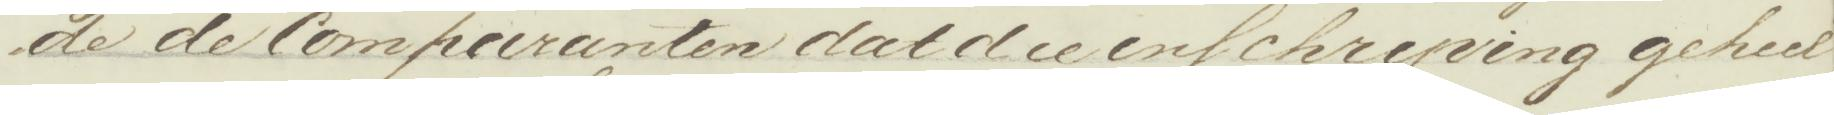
„de de Comparanten dat die inschryving geheel
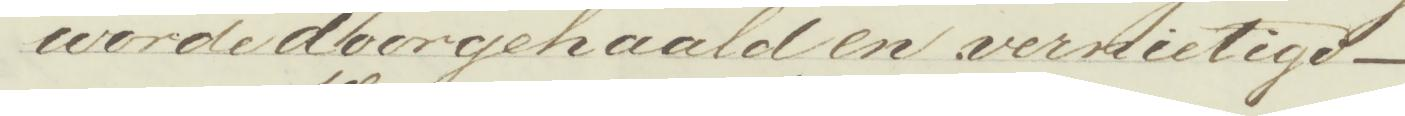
worde doorgehaald en vernietigd —
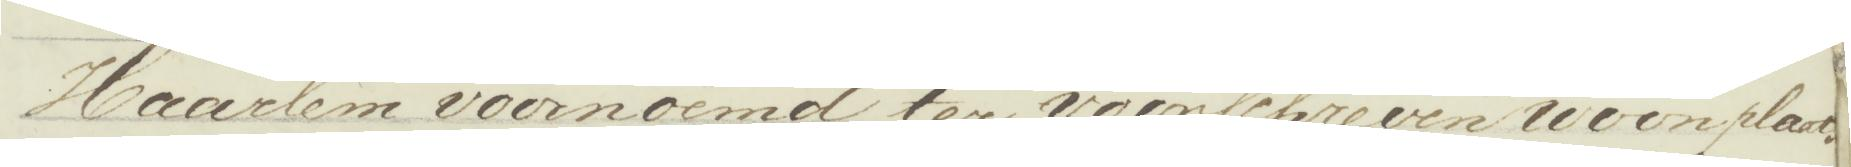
Haarlem voornoemd, ter voorschreven woonplaat„
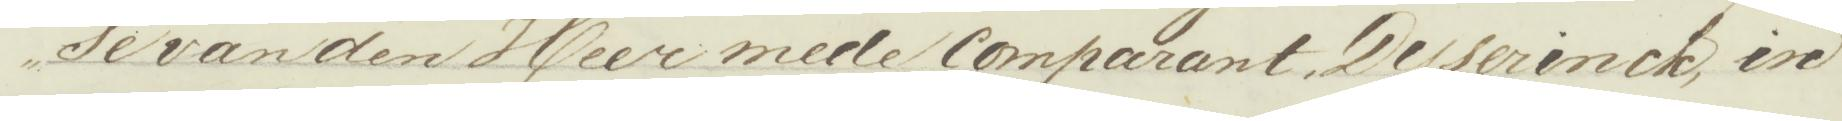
„se van den Heer mede Comparant, Dyserinck, in
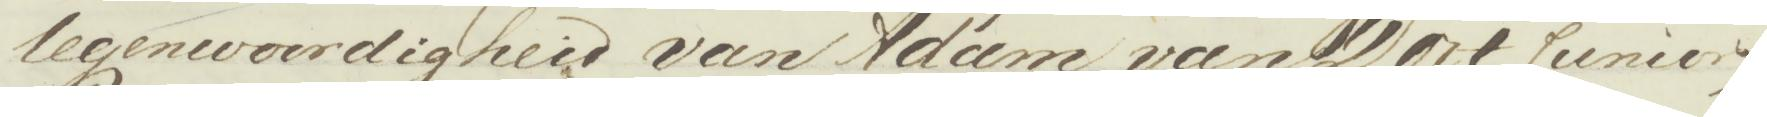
tegenwoordigheid van Adam van Dort Junior,
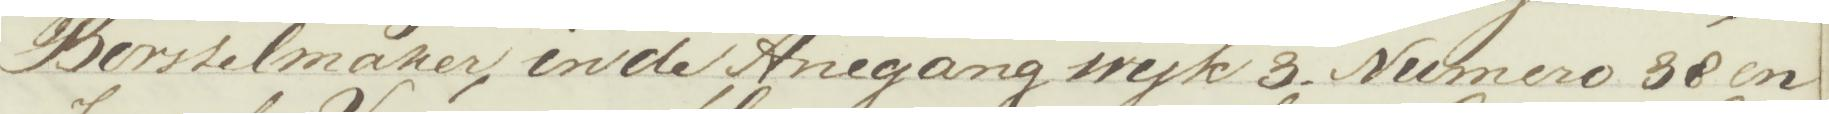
Borstelmaker, in de Anegang wyk 3. Numero 38 en
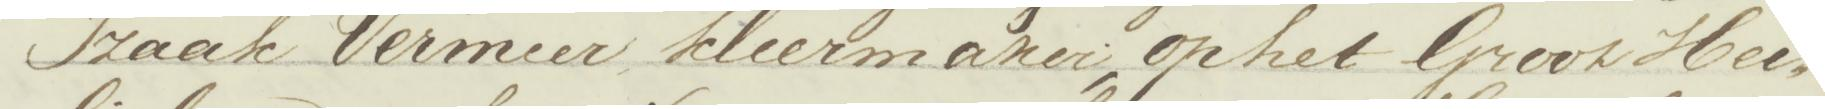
Jzaak Vermeer, kleermaker, op het Groot Hei„
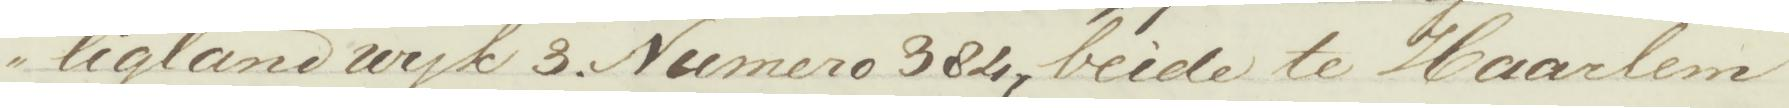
„ ligland wyk 3 Numero 384, beide te Haarlem
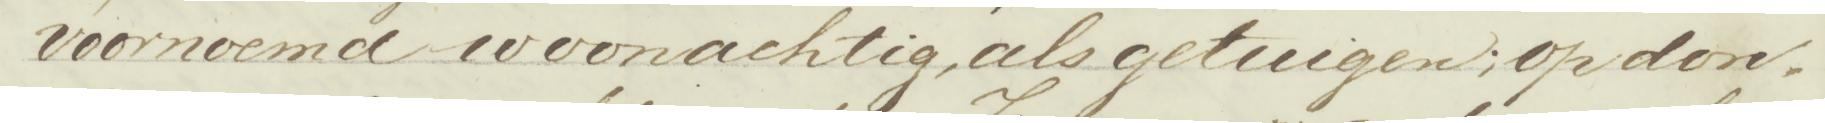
voornoemd woonachtig, als getuigen; op don„
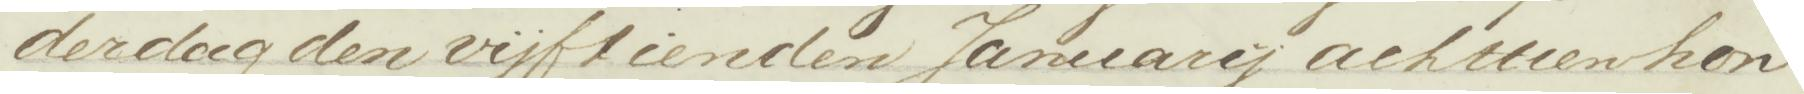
derdag den vijftienden Januarij achttien hon
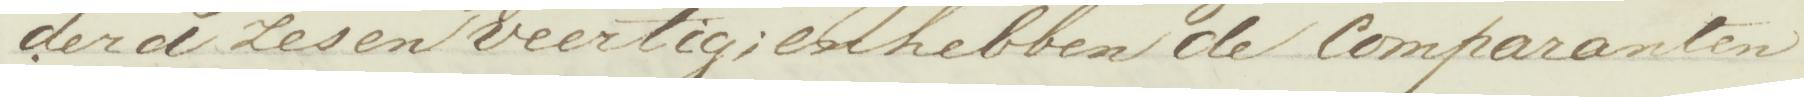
derd zes en veertig; en hebben de Comparanten
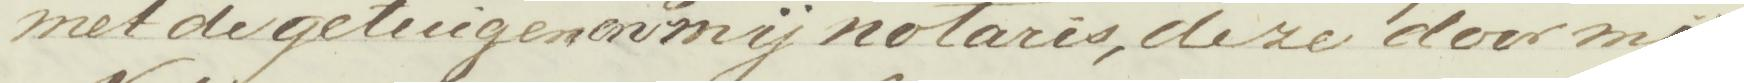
met de getuigen en mij notaris, deze door mij
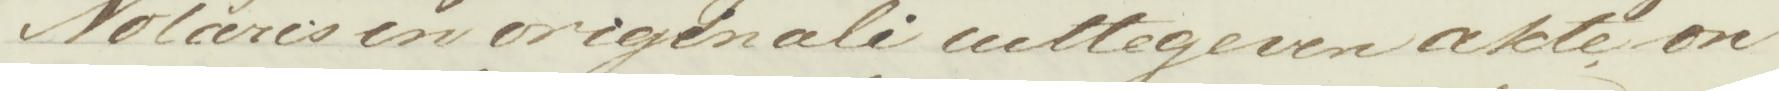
Notaris in originali uittegeven akte, on
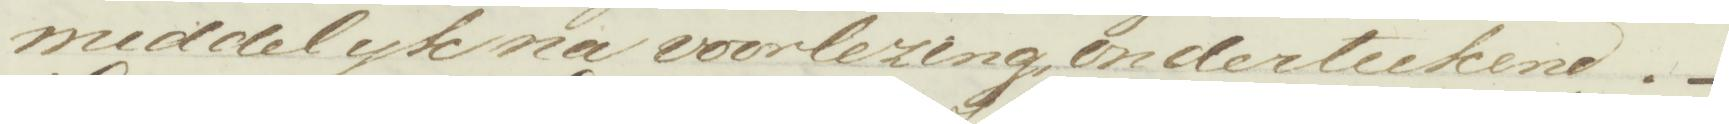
middelyk na voorlezing, onderteekend.-
